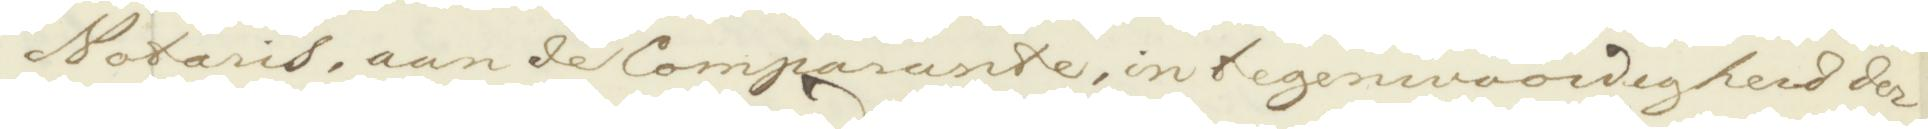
Notaris, aan de Comparante, in tegenwoordigheid der
